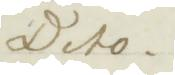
Dito. . . . . . . .
